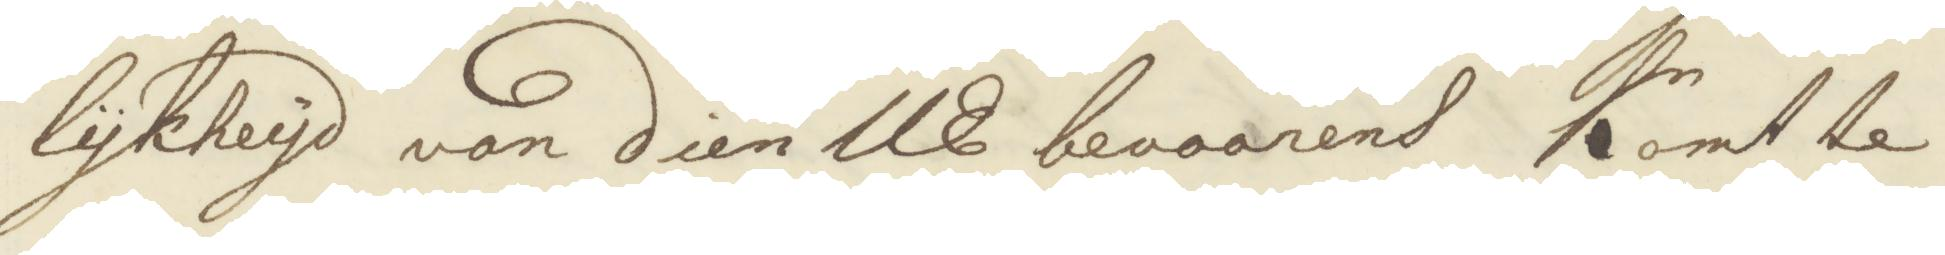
lijkheijd van dien UE bevoorens komt te
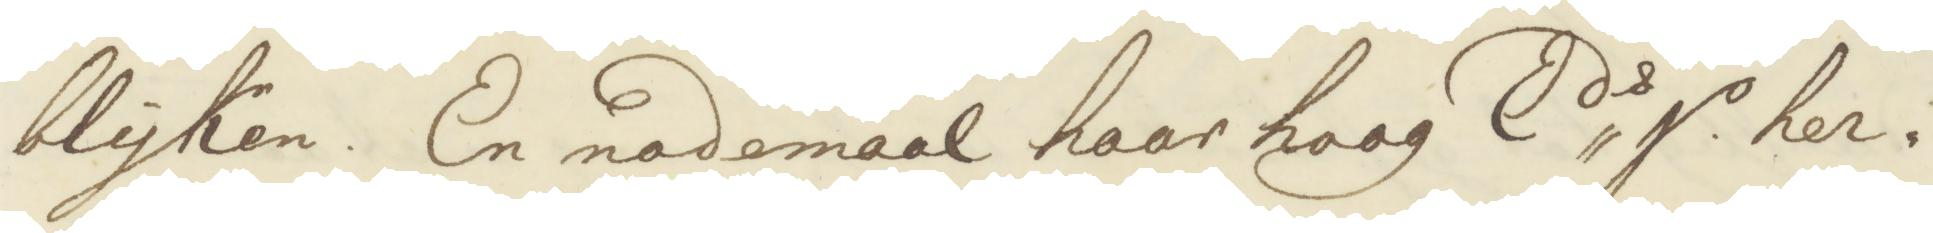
blijken. En nademaal haar hoog E„ds J.o her„
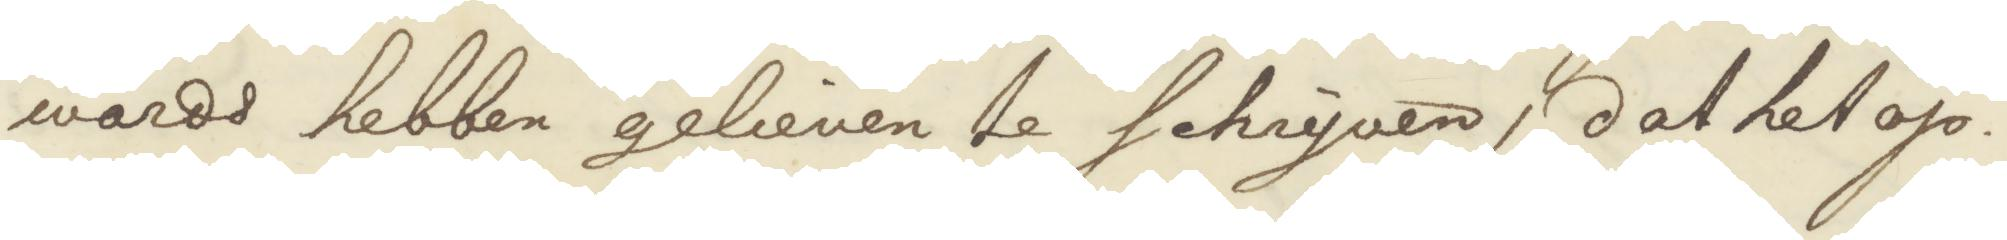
wards hebben gelieven te schrijven, dat het op
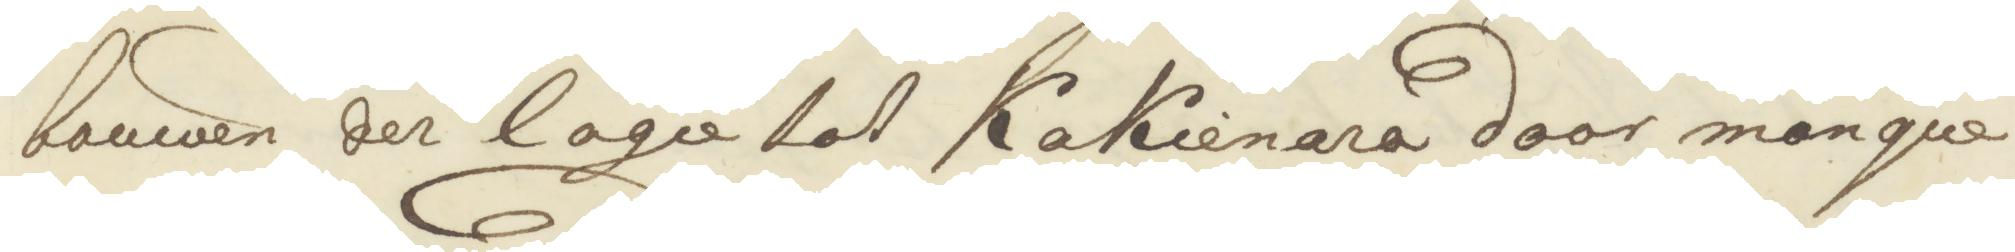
bouwen der logie tot kakienara door manque
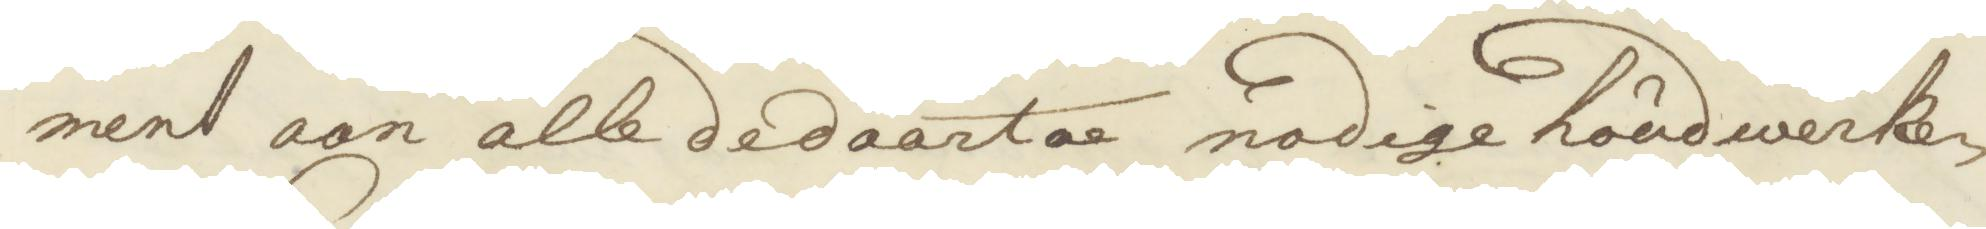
ment aan alle de daartoe nodige houdwerken
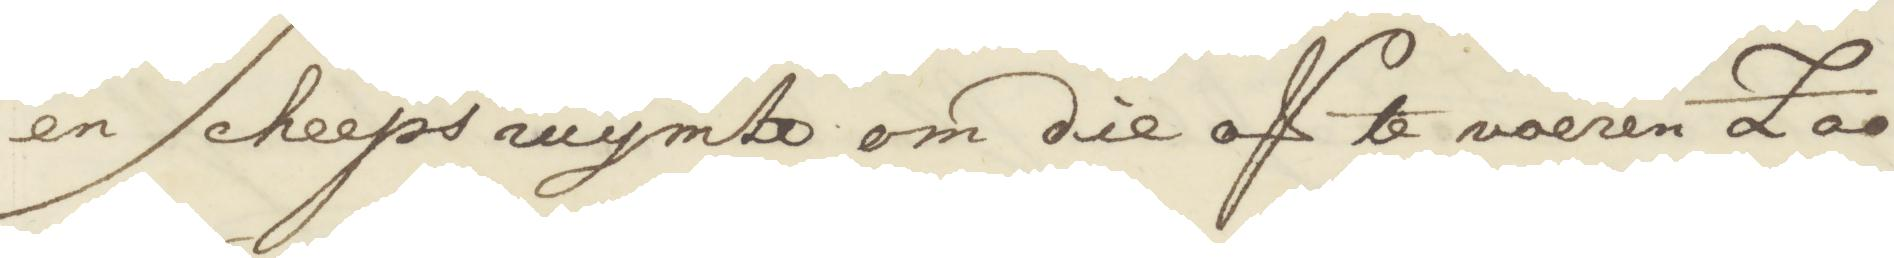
en scheeps ruijmte om die over te voeren zoo
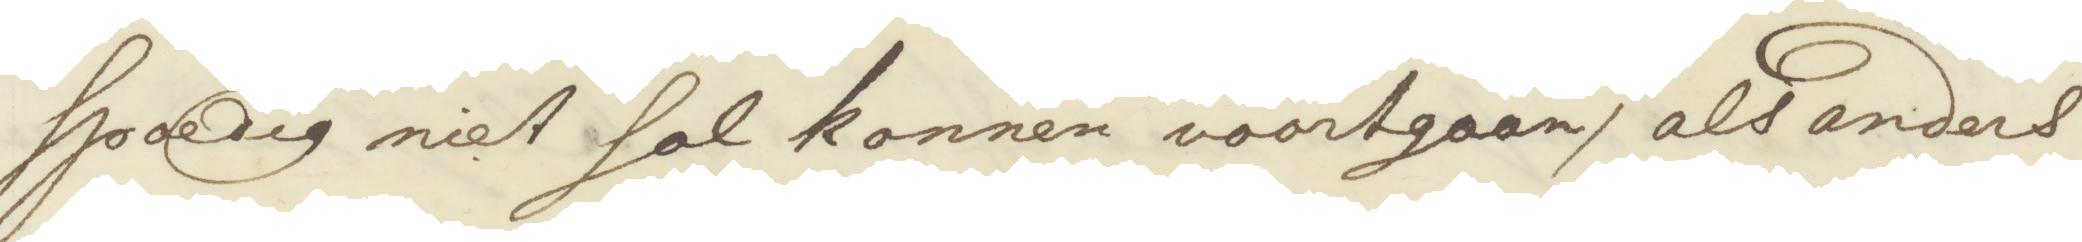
spoedig niet sal konnen voortgaan, als anders
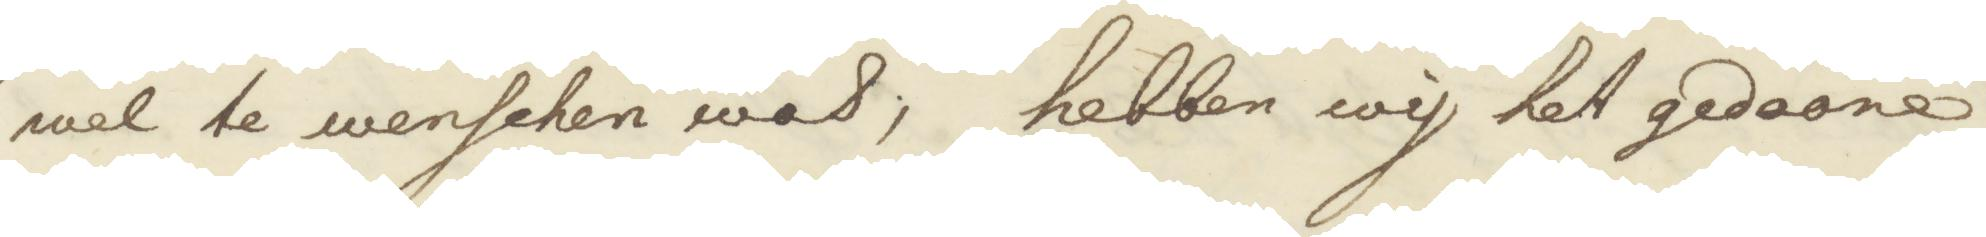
wel te wenschen was; hebben wij het gedaane
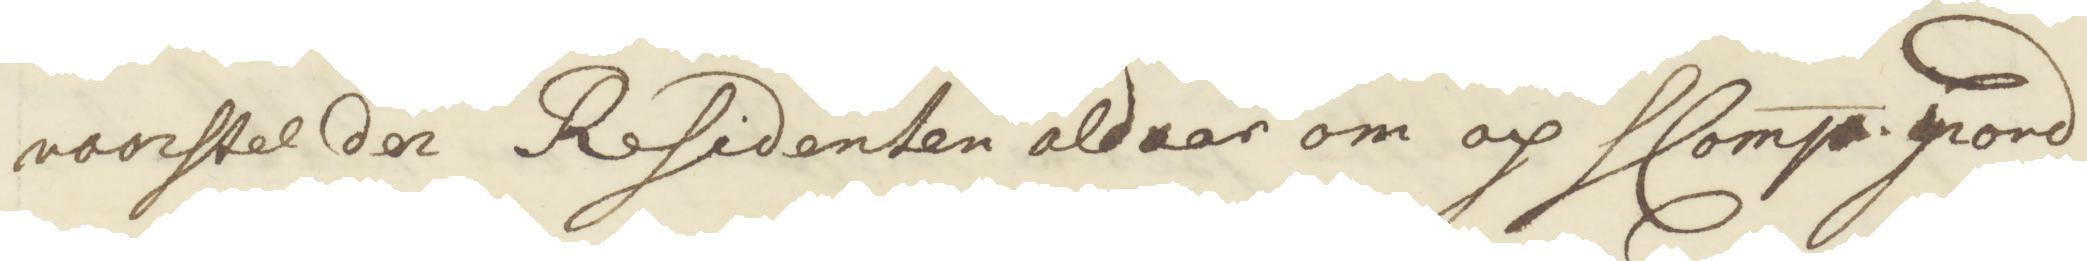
voorstel der Residenten aldaar om op sComp: grond
